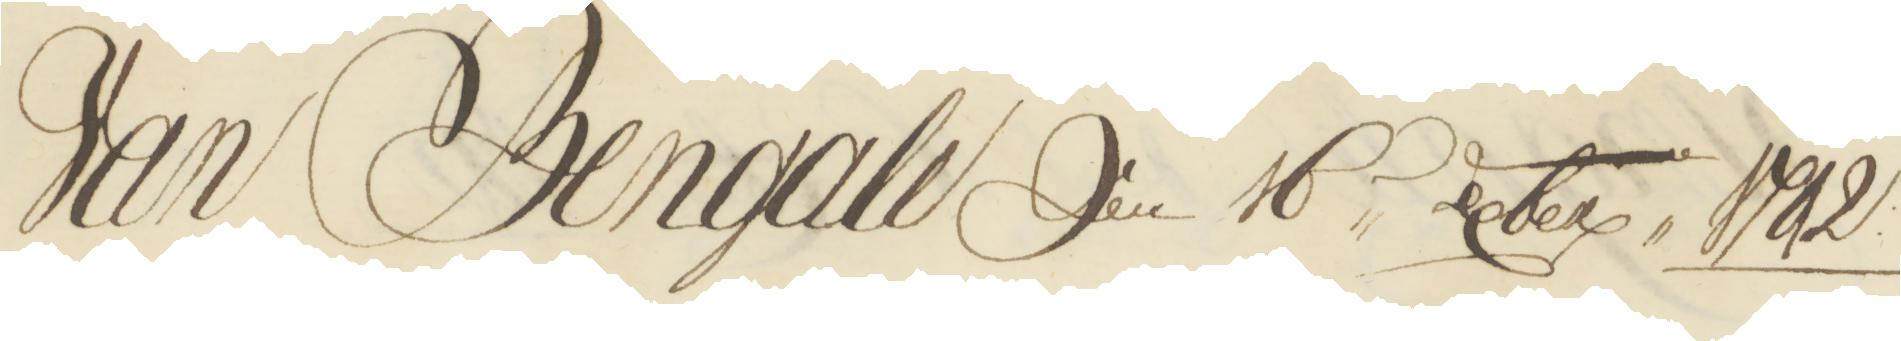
Van Bengale Den 16„' xber„ 1742:
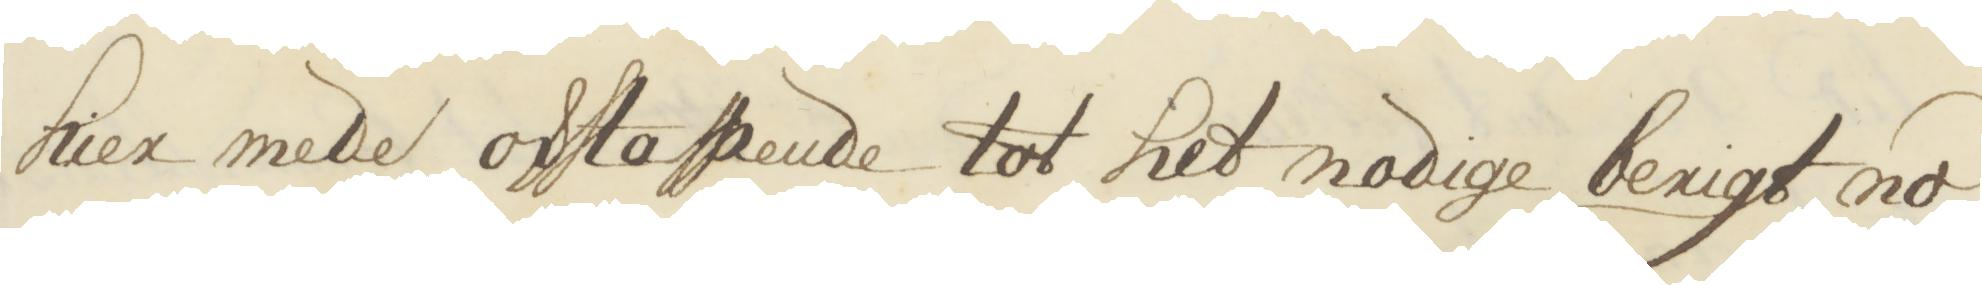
hier mede overstappende tot het nodige berigt no
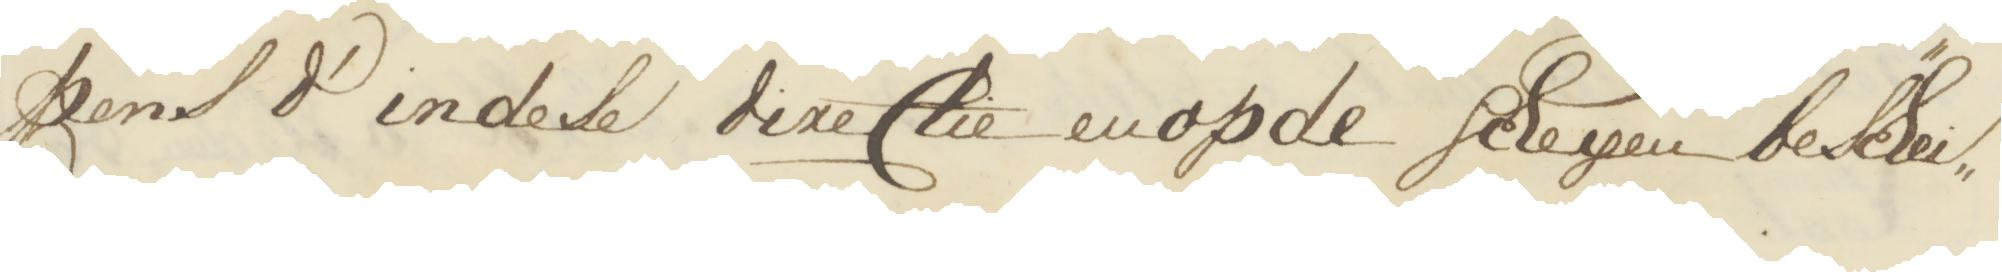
pens d’ indese directie en op de schepen beschei„
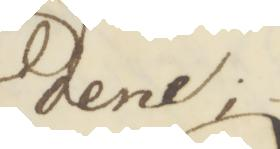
dene;
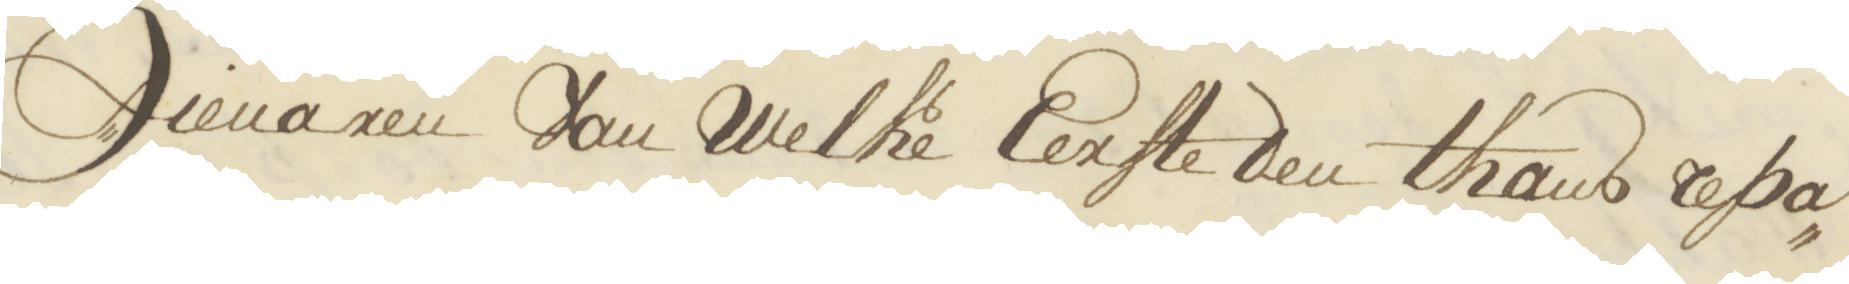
„Dienaren van welke Eerste den thans repa„
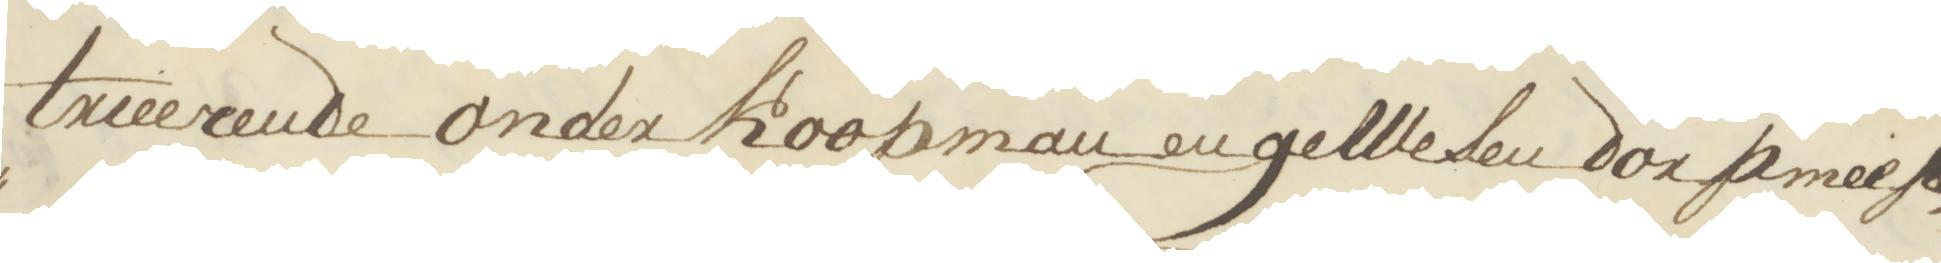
trieerende onderkoopman en gewesen dorpmeester
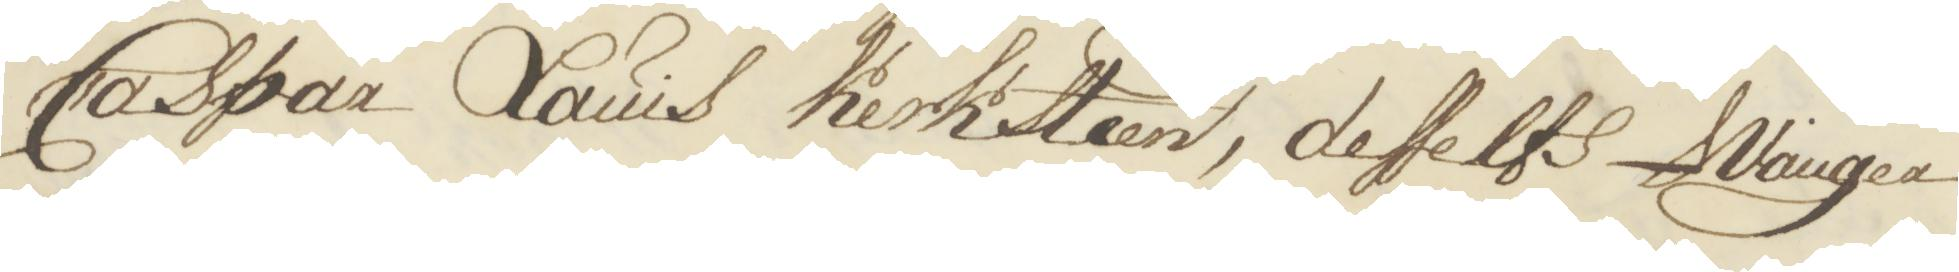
Caspar Louis kerksteen, desselfs vervanger
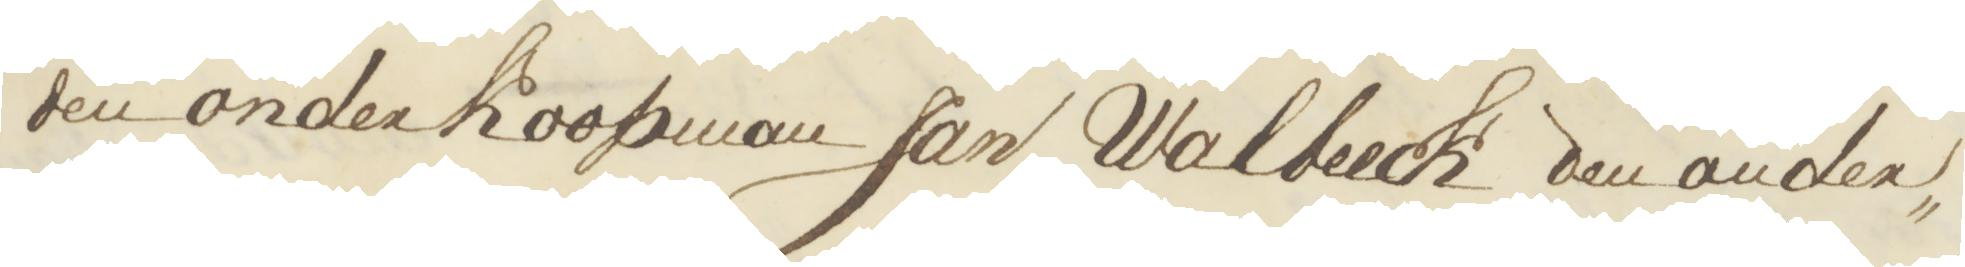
den onderkoopman Jan Walbeeck den onder„
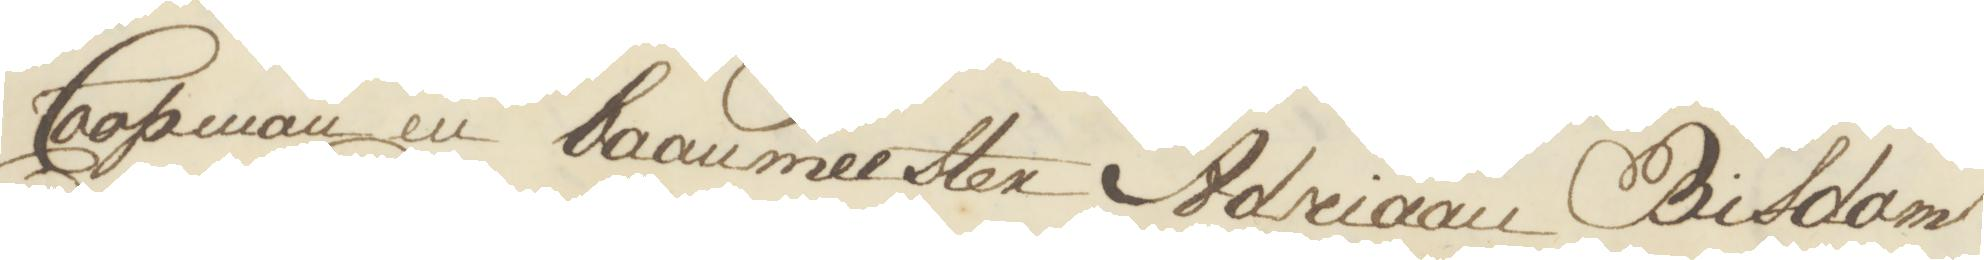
coopman en baanmeester Adriaan Bisdom
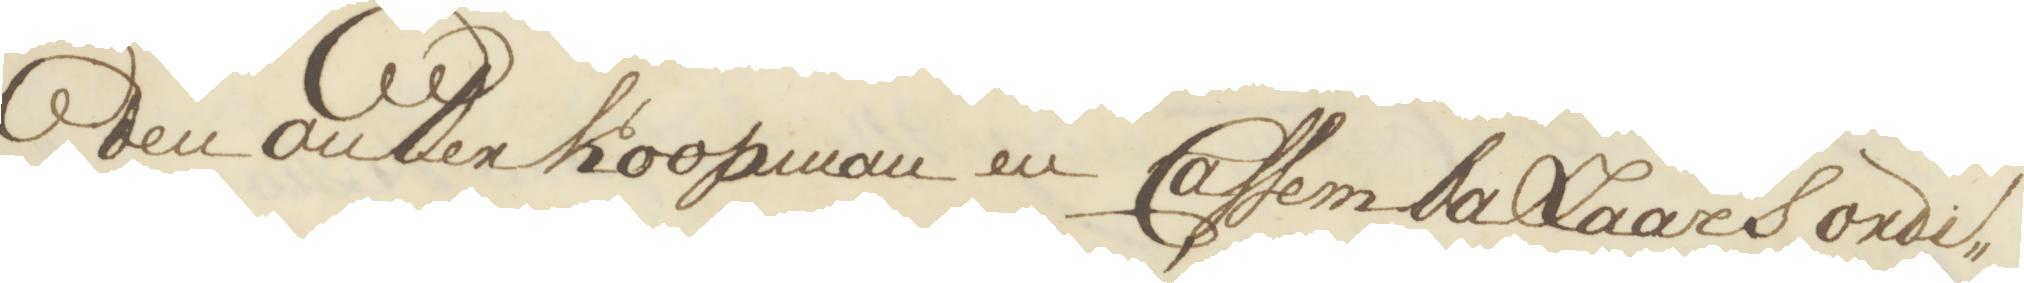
den onderkoopman en Cassembazaars ordi„
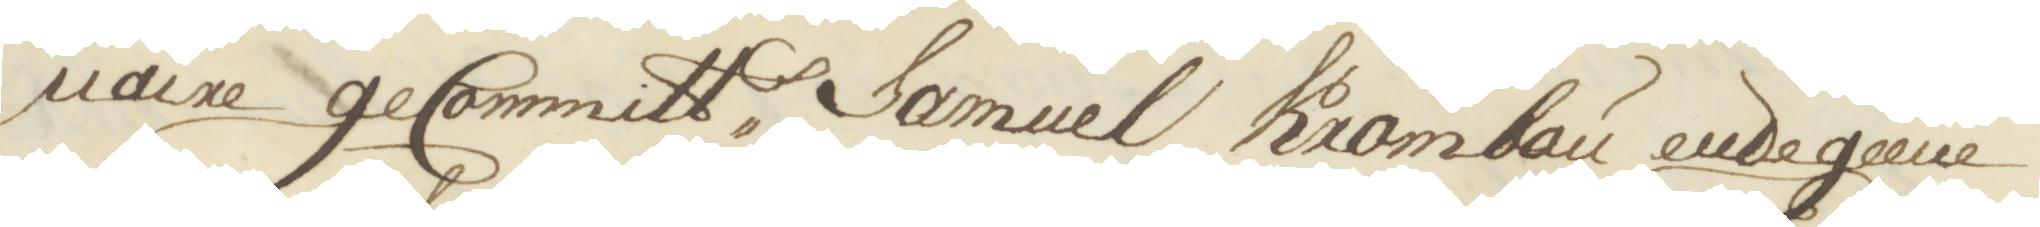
naire gecommitt„s Samuel Krombau ende geene
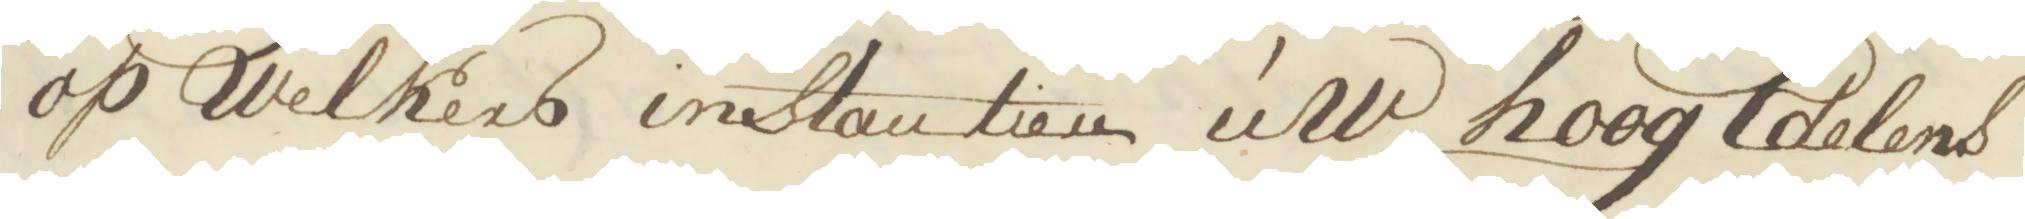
op welkers instantien uw hoog Edelens
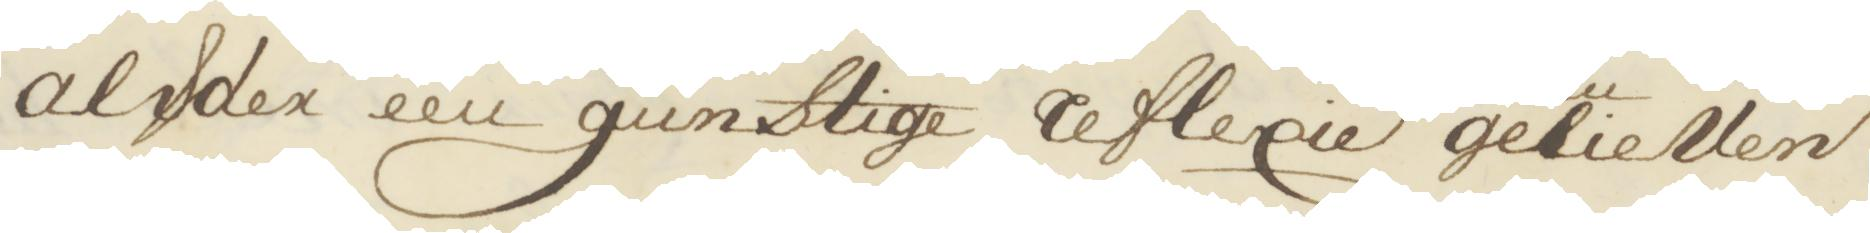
alverder een gunstige reflexie gelieven
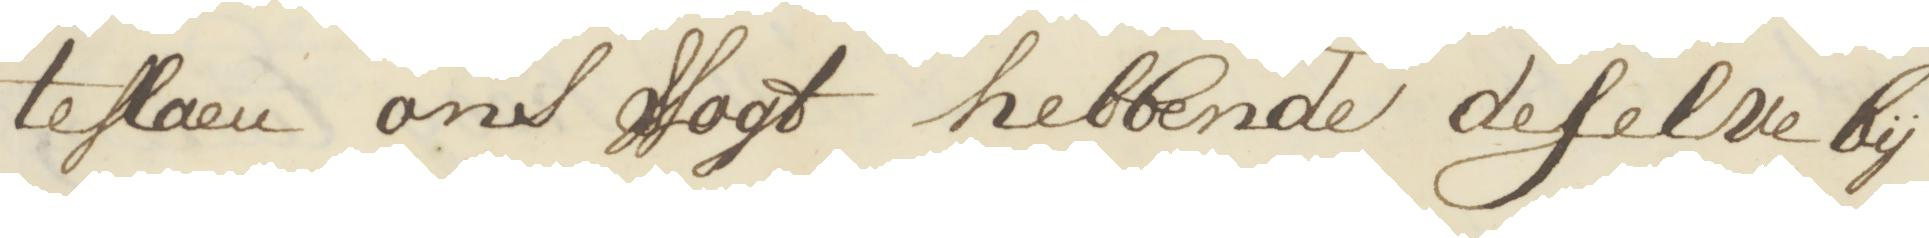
te slaen ons versogt hebbende deselve bij
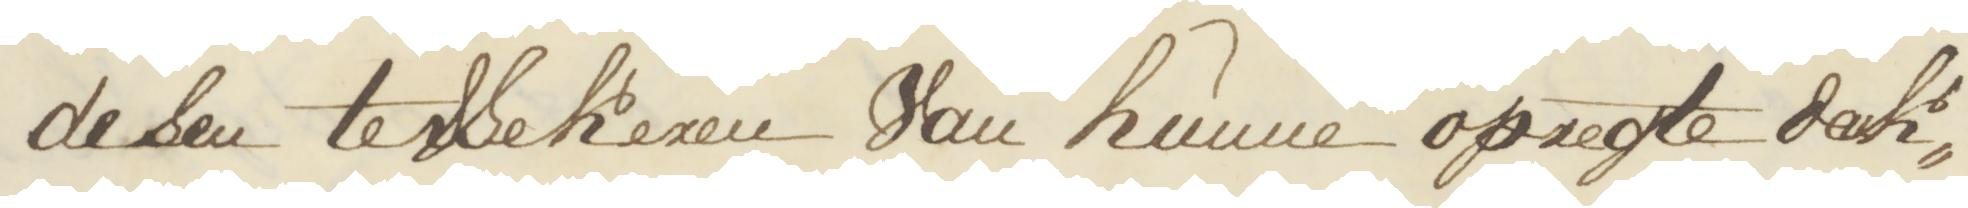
desen te versekeren van hunne opregte dank„
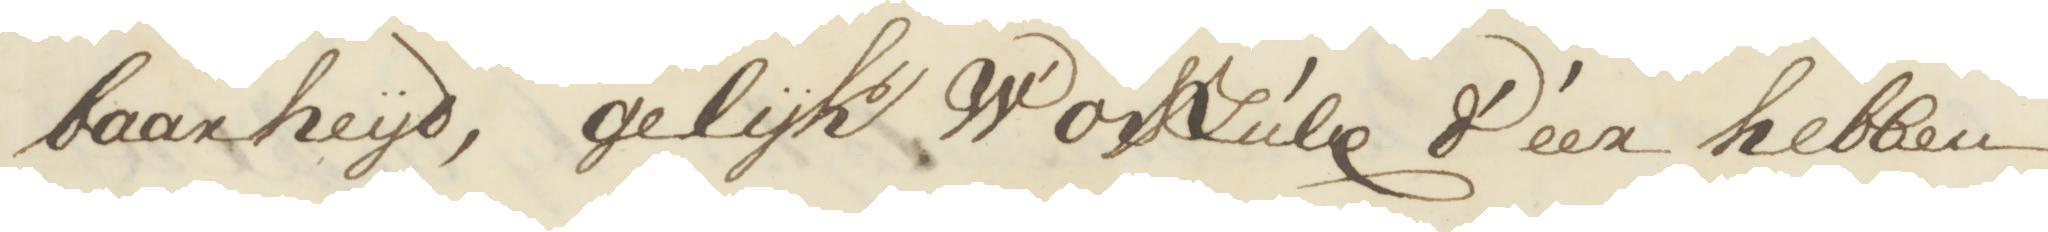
baarheijd, gelijk W' overzulx d''eer hebben
